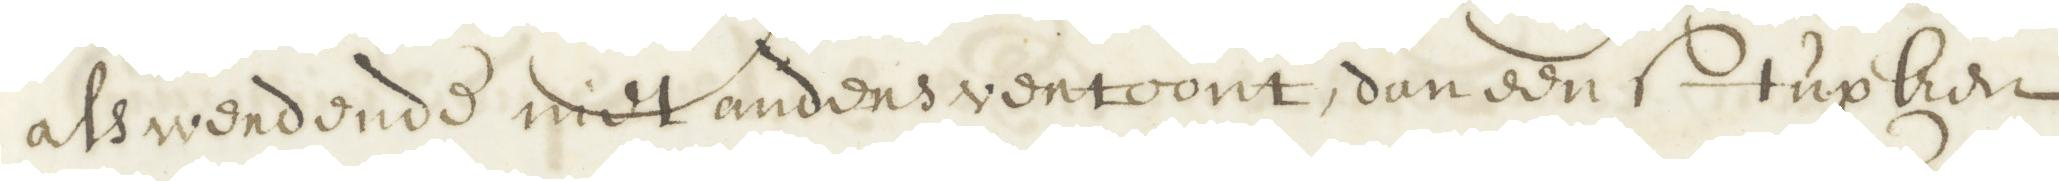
als werdende niet anders vertoont, dan een stuxken
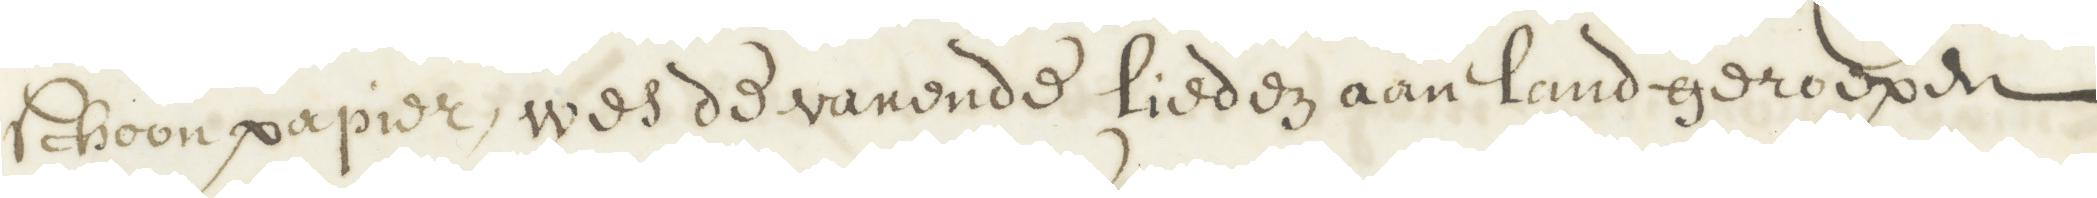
schoon papier, wes de varende lieden aan land geroepen
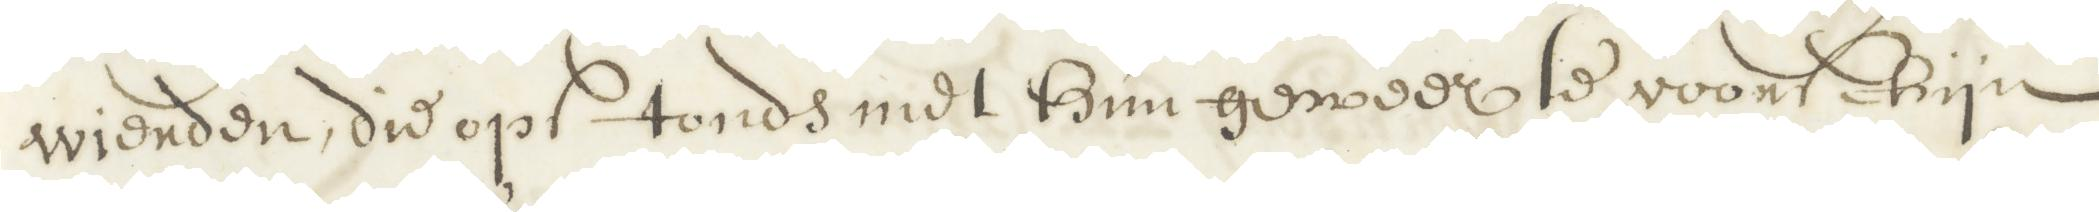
wierden, die opstonds met hun geweer te voorschijn
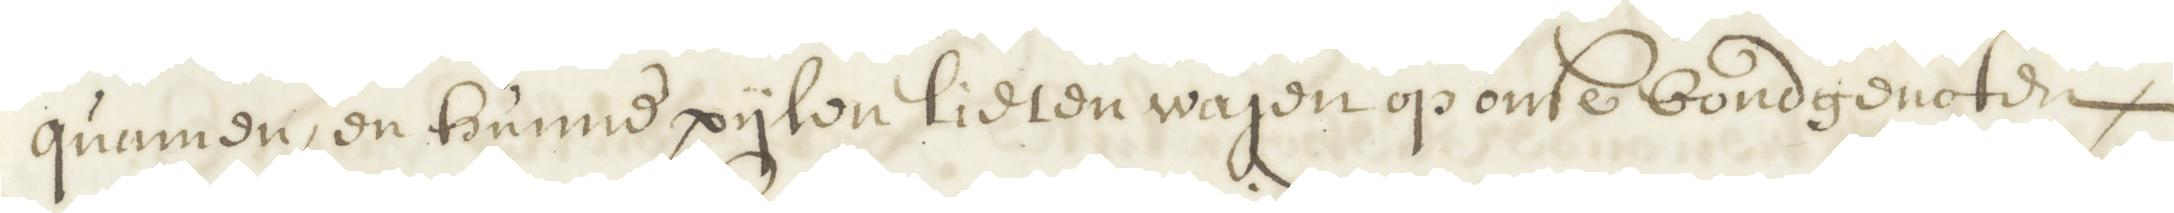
quamen, en hunne pijlen lieten wajen op onse bondgenoten,
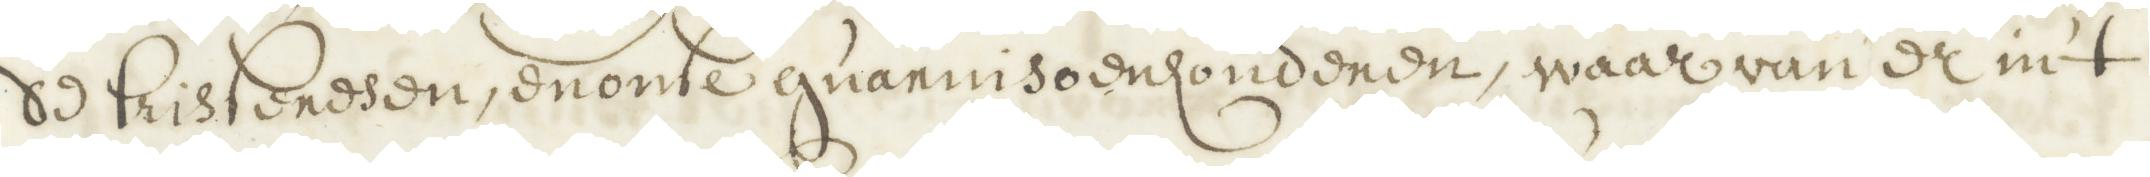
de kisseresen, en onse guarnisoenhouderen, waar van 'er in ’t
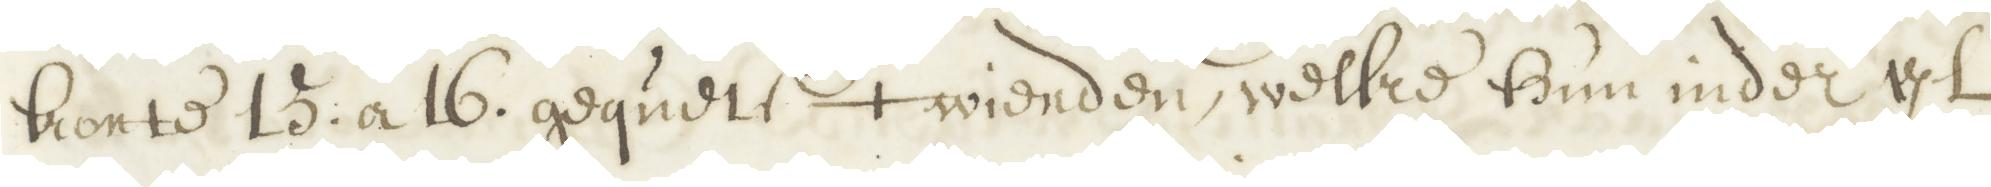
korte 15: a 16. gequetst wierden, welke hun inder yl
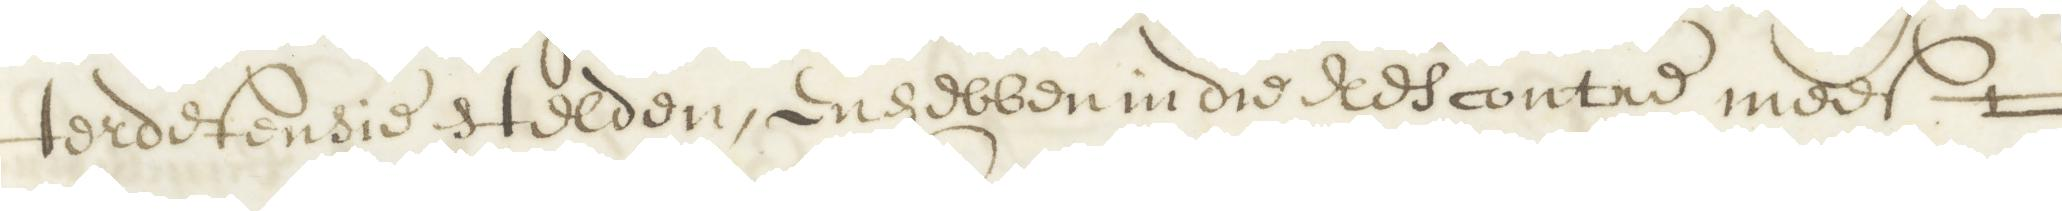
terdefensie stelden, en hebben in die rescontre meest
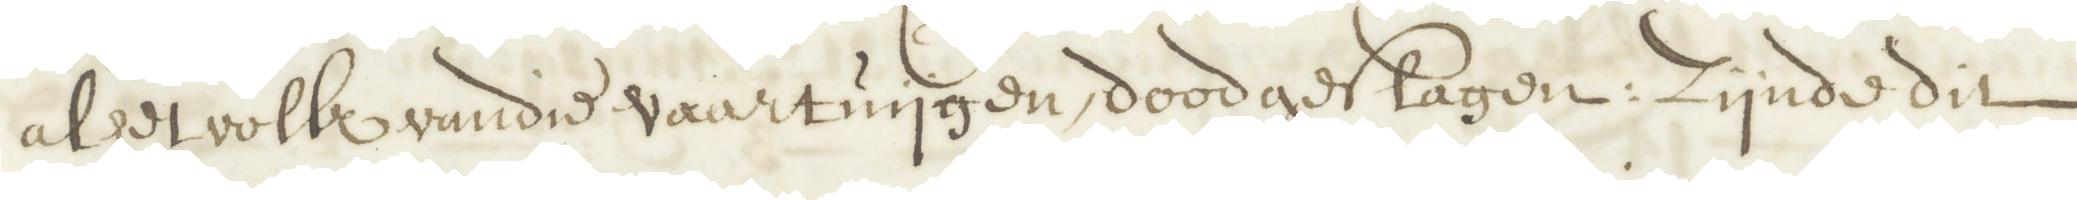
alhet volk van die vaartuijgen, dood geslagen: zijnde dit
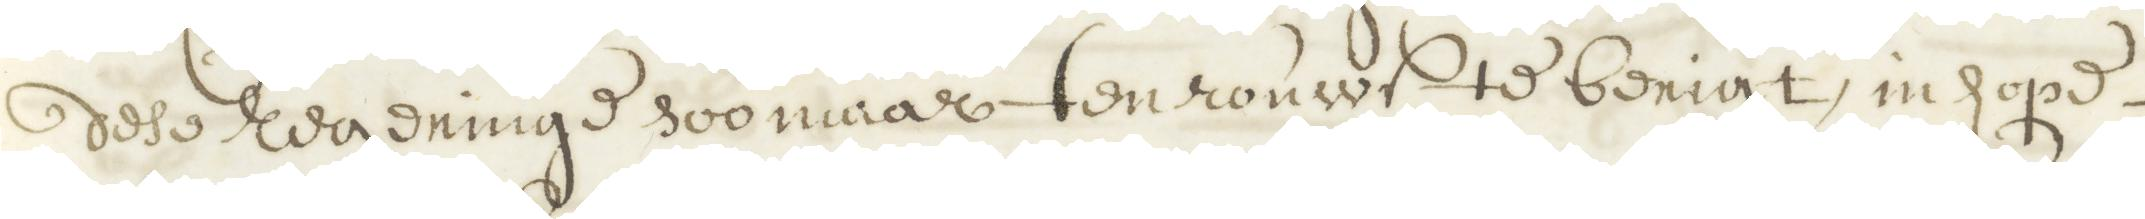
dese regeringe soo maar ten rouws te berigt, in hope —
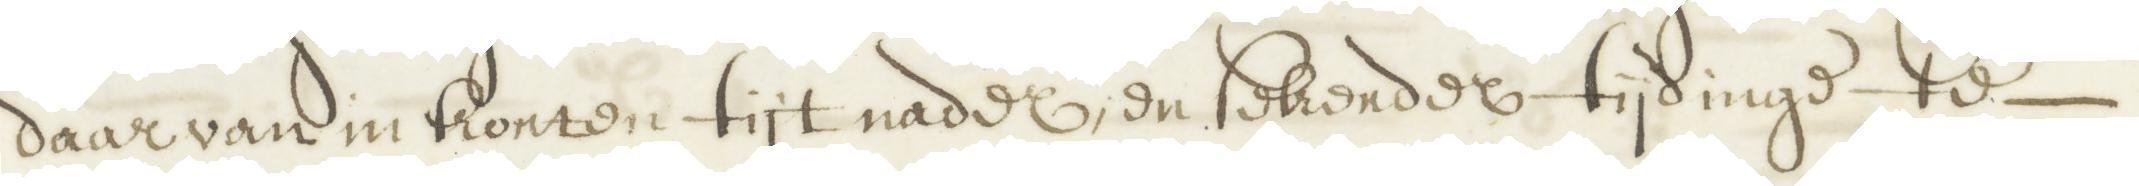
daar van in korten tijt nader, en sekerder tijdinge te —
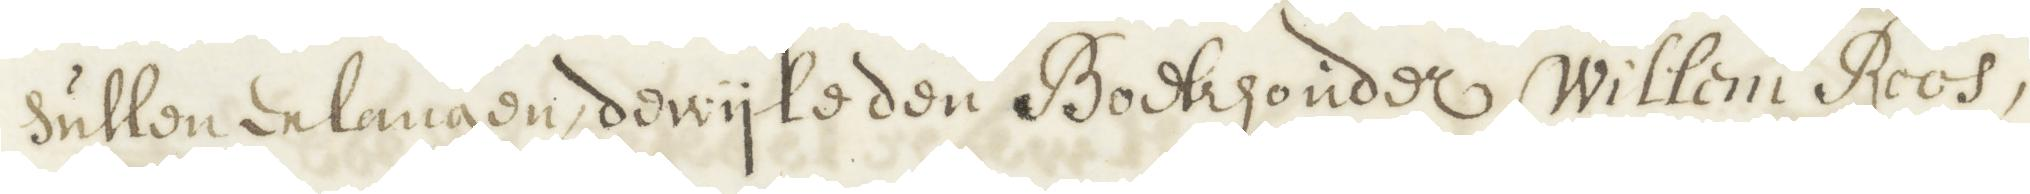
sullen erlangen, dewijle den Boekhouder Willem Roos
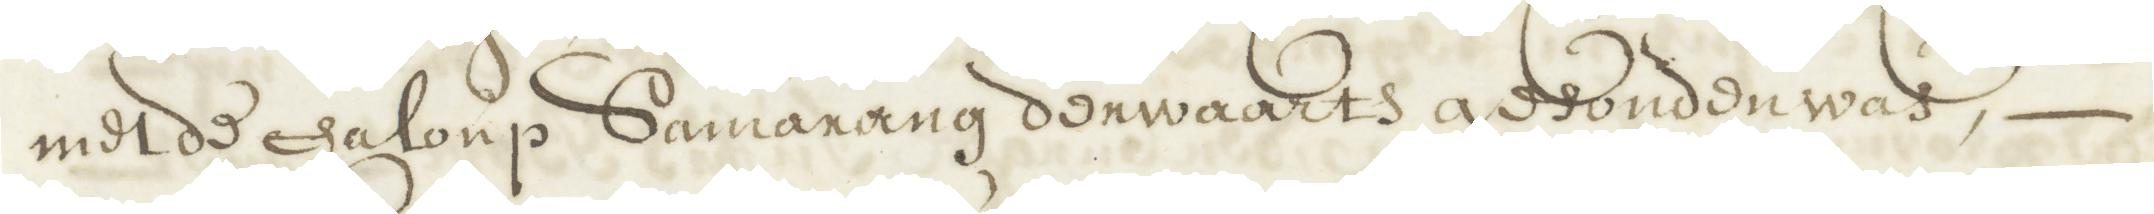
met de chaloup Samarang derwaarts gesonden was,—
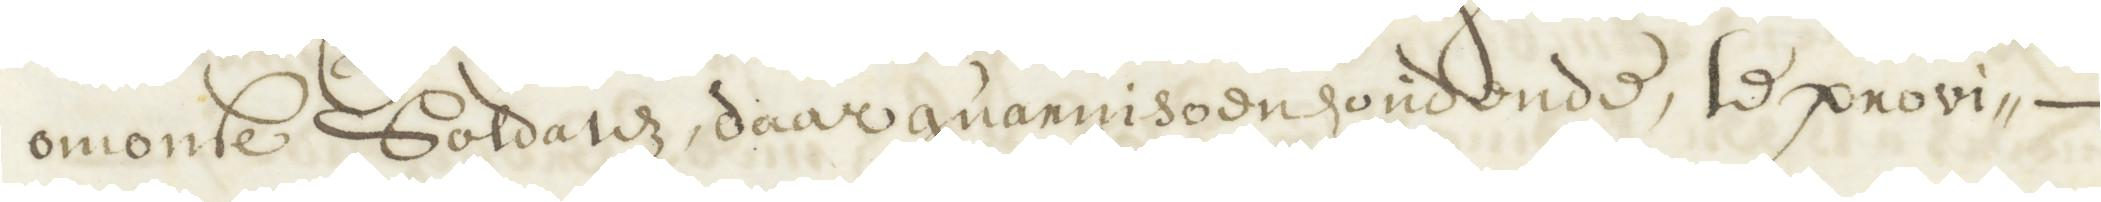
om onse soldaten, daar guarnisoen houdende, te provi„—
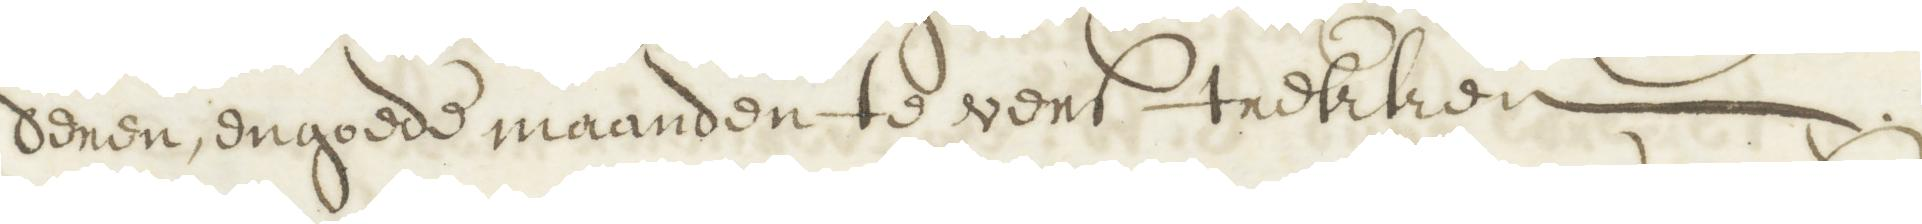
deren, en goede maanden te verstrekken.
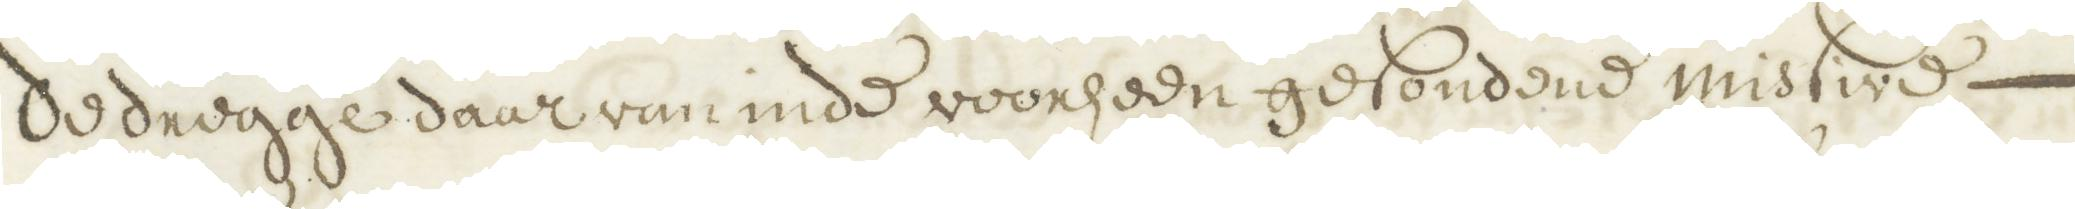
de dregge daar van in de voorheen gesondene missive —
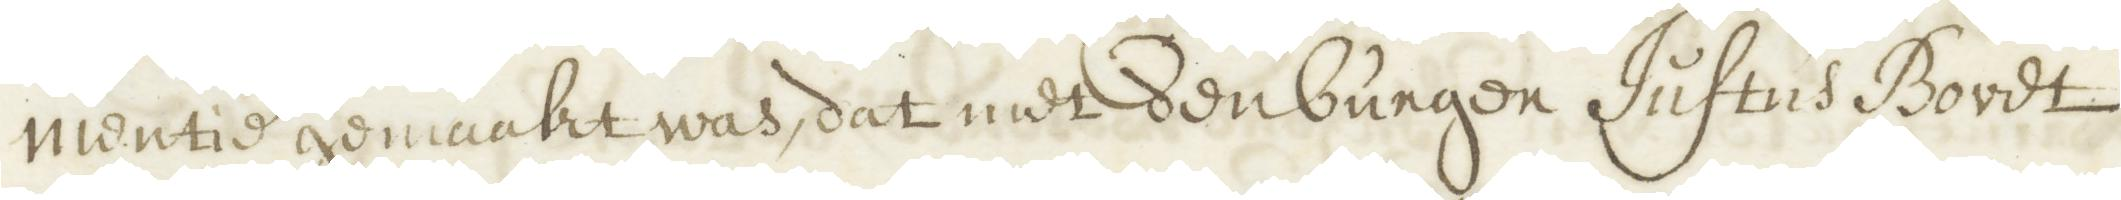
mentie gemaakt was, dat met den burger Justus Bovet
